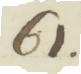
61.
